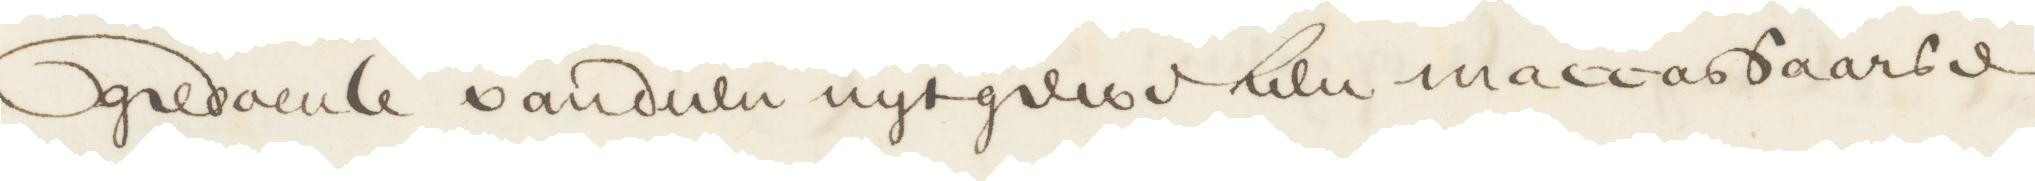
gedoente vandien uijtgeweken maccassaarse
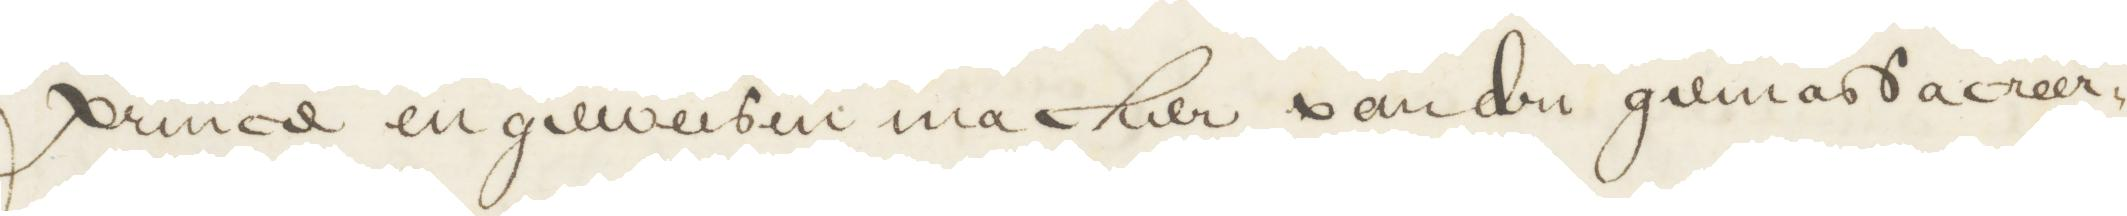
prince en geweesen macker van den gemassacreer
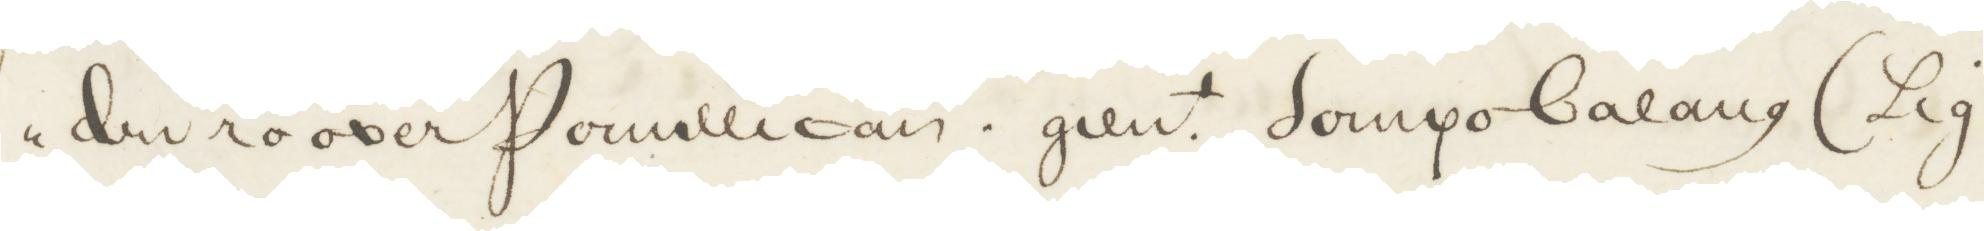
den roover Pomelican. gen.t tompobalang (sig
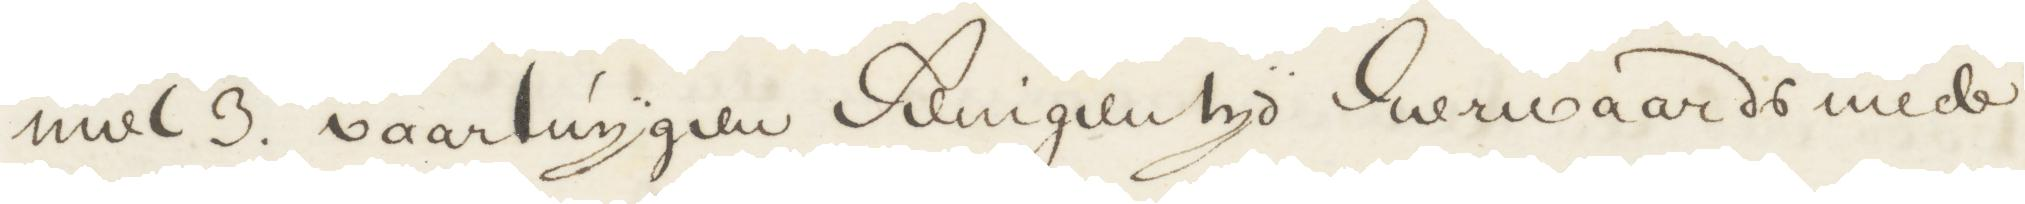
met 3. vaartuijgen Eenigen tijd hierwaards mede
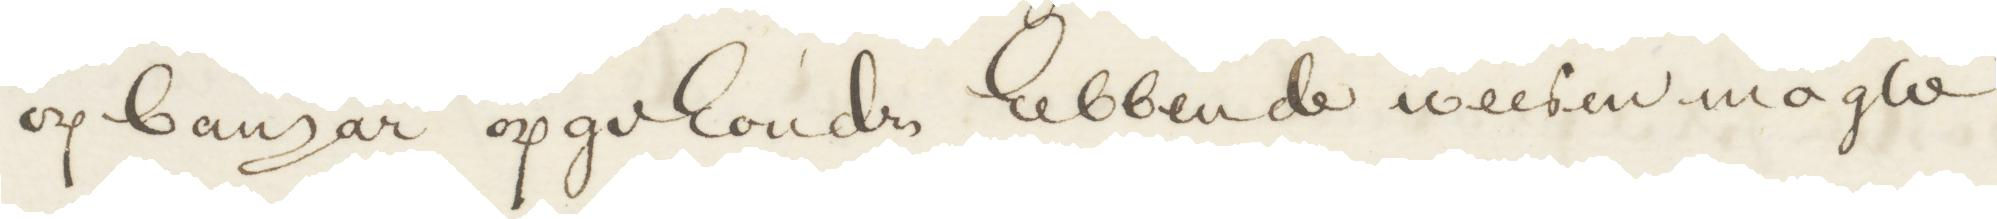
op banjar opgehouden hebbende weesen mogte
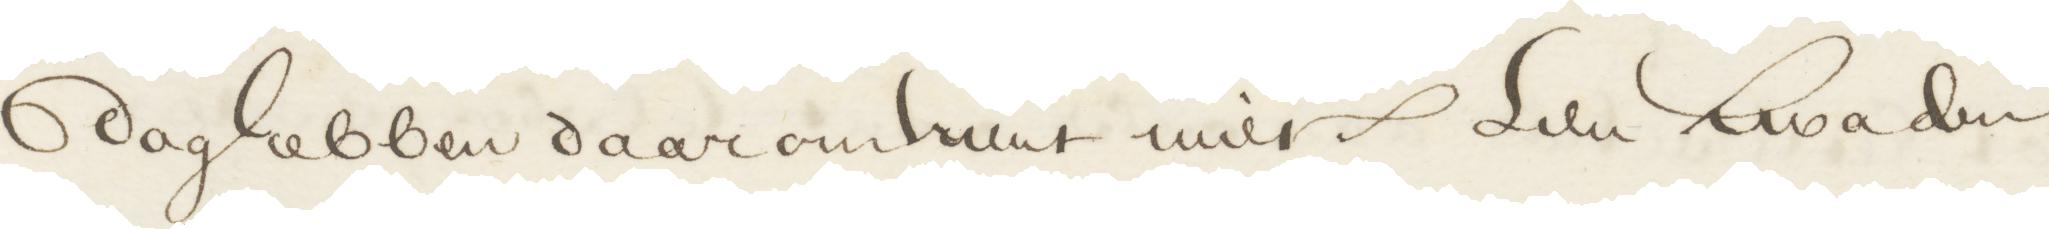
dog hebben daar omtrent niets ten kwaden
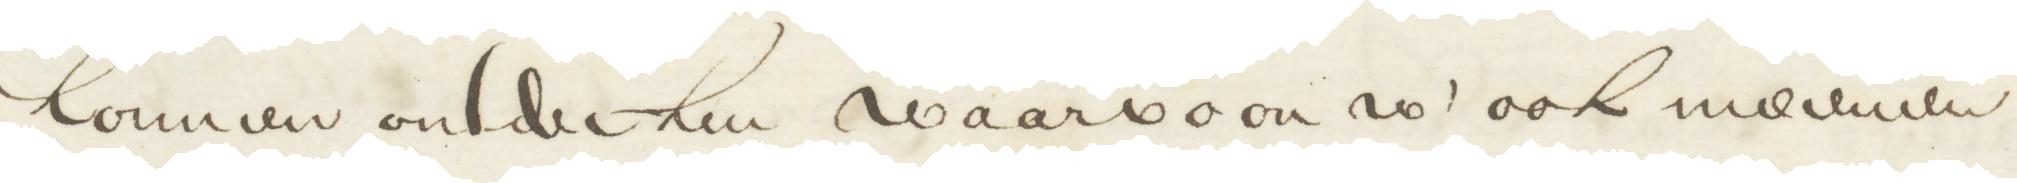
konnen ontdecken waarvoor w' ook meenen
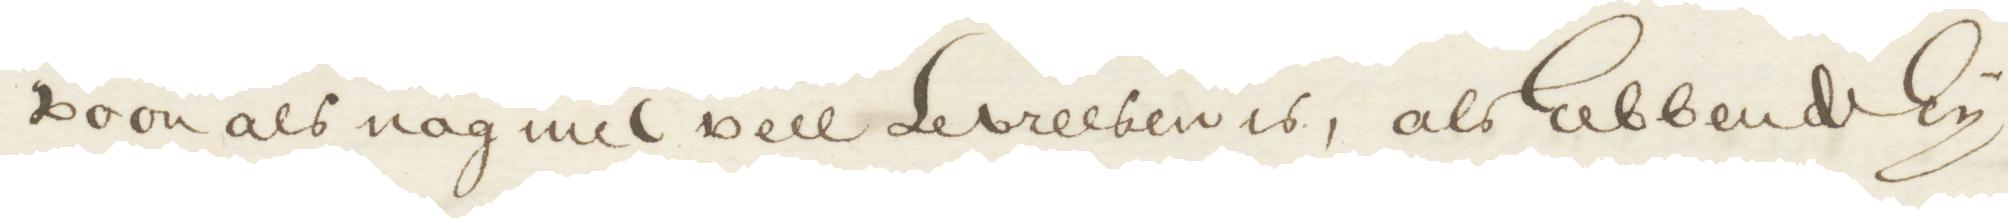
voor als nog niet veel tevreesen is, als hebbende hij
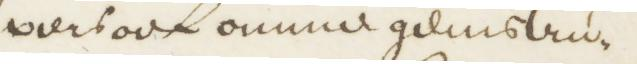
versoek omme geinstru„
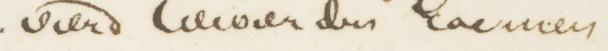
eerd tewerden hoe men
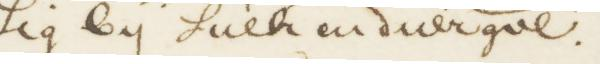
sig bij sulk en dier gelijk
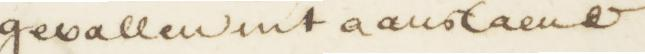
gevallen in 't aanstaende
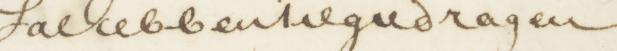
sal hebben te gedragen
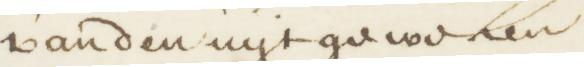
van den uijtgeweken
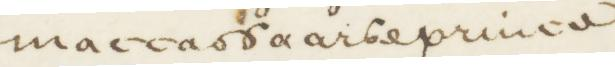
maccassaarse prince
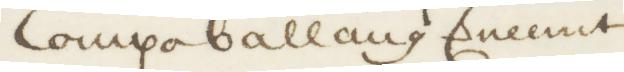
tompaballang verneemt
